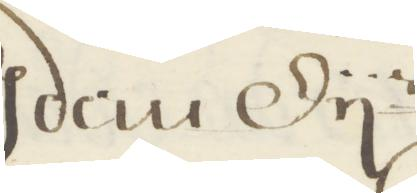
Jdem Eij=r
